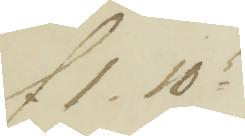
ƒ1. 10=5
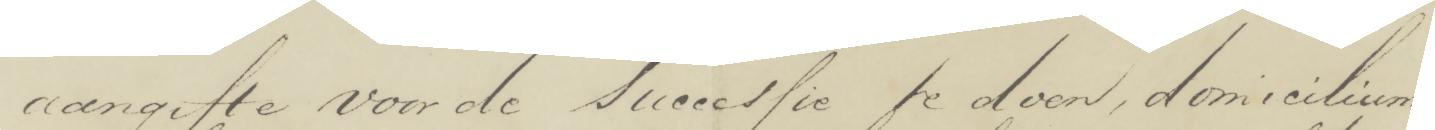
aangifte voor de Successie te doen, domicilium
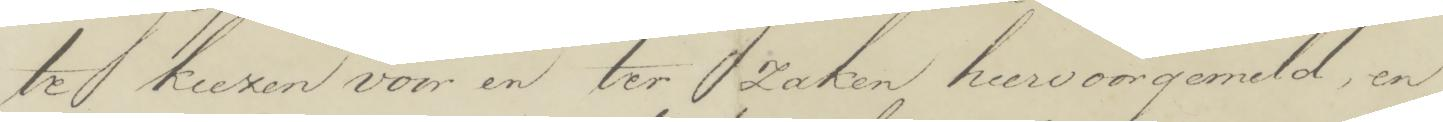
te kiezen voor en ter zaken hiervoorgemeld, en
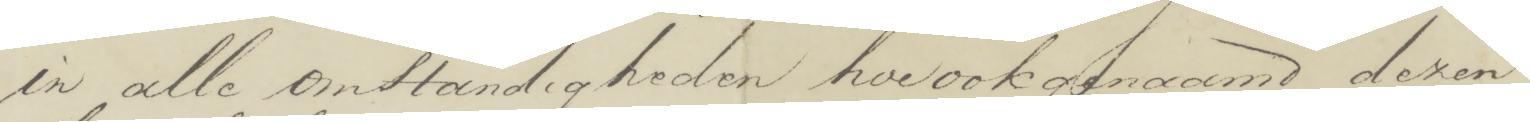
in alle omstandigheden hoe ook genaamd dezen
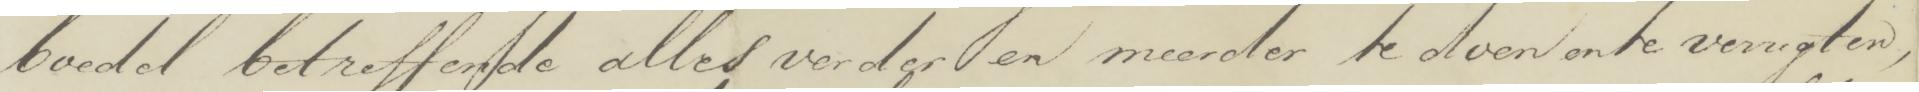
boedel betreffende alles verder en meerder te doen en te verrigten,
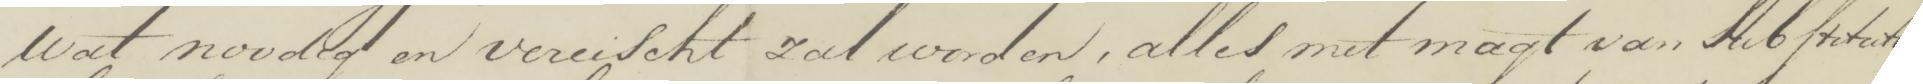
wat noodig en vereischt zal worden, alles met magt van substitutie
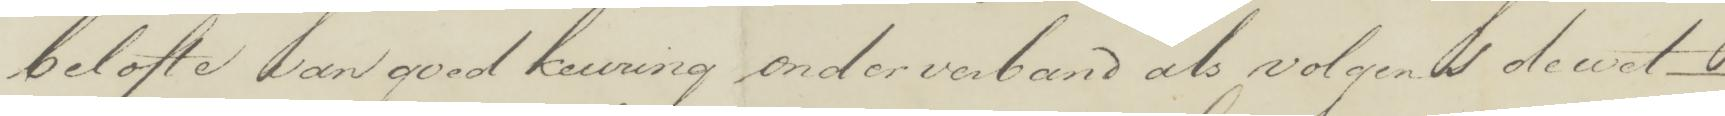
belofte van goed keuring, onder verband als volgens de wet
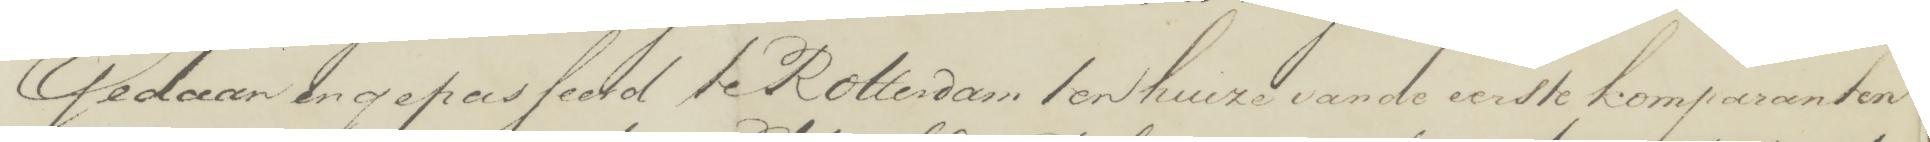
Gedaan en gepasseerd te Rotterdam ten huize van de eerste komparanten
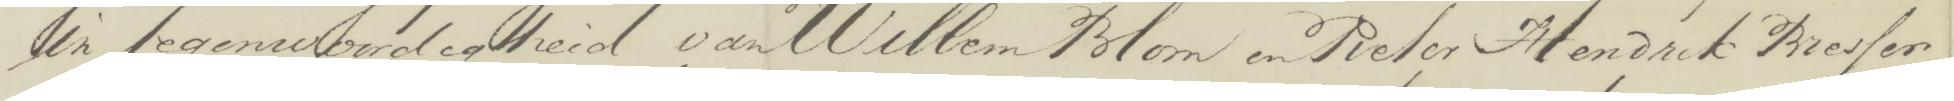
in tegenwoordigheid van Willem Blom en Pieter Hendrik Bresser
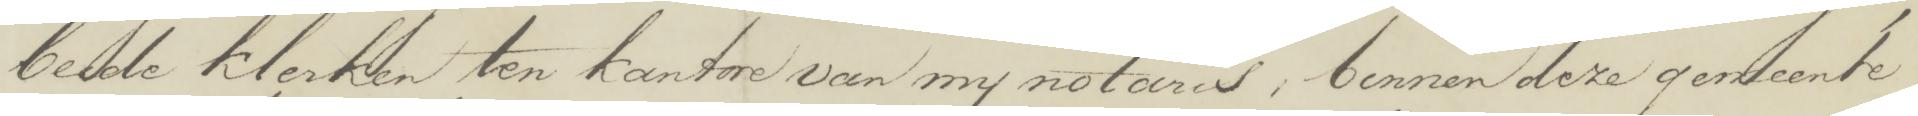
beide klerken, ten kantore van my notaris; binnen deze gemeente
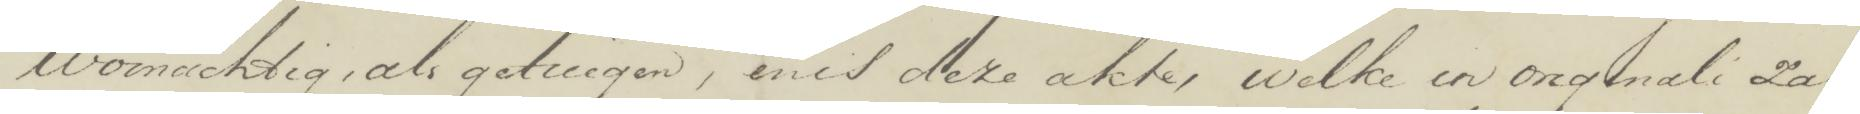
woonachtig, als getuigen, en is deze akte, welke in originali zal
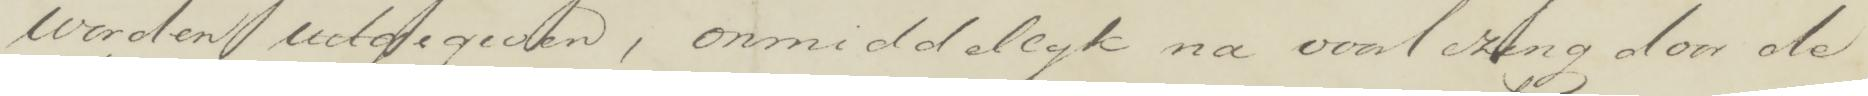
worden uitgegeven, onmiddellyk na voorlezing door de
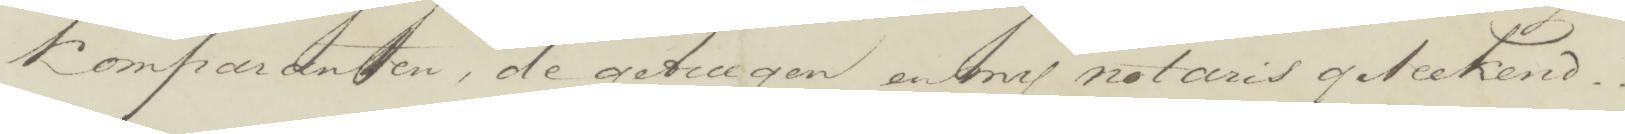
Komparanten, de getuigen en my notaris geteekend.
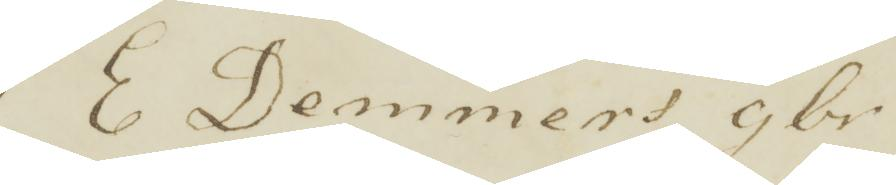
J E Demmers gbr
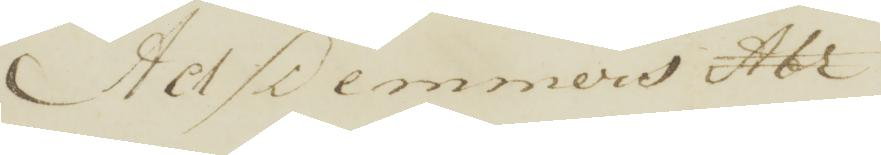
Ad Demmers Abr
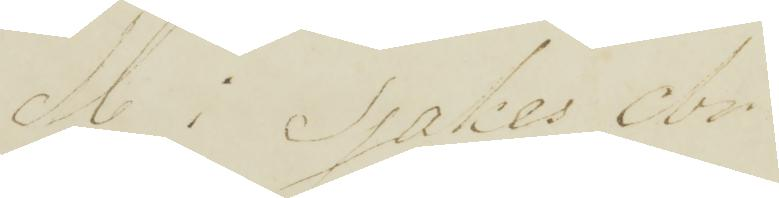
M : Sjakes cbr
